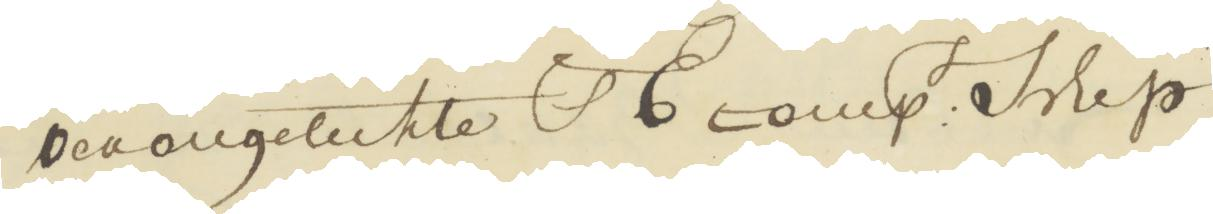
verongelukte s' E comp:s Schip
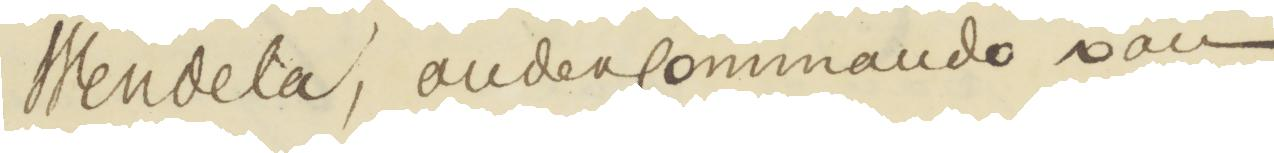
Wendela, onder Commando van
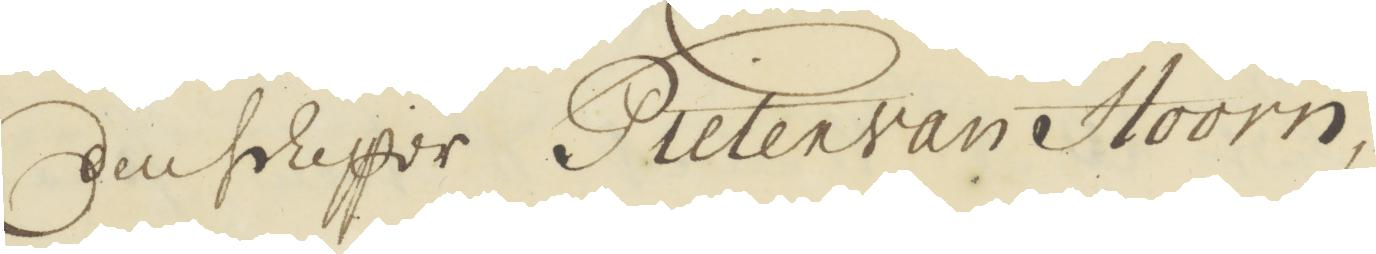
den Schipper Pieter van Hoorn,
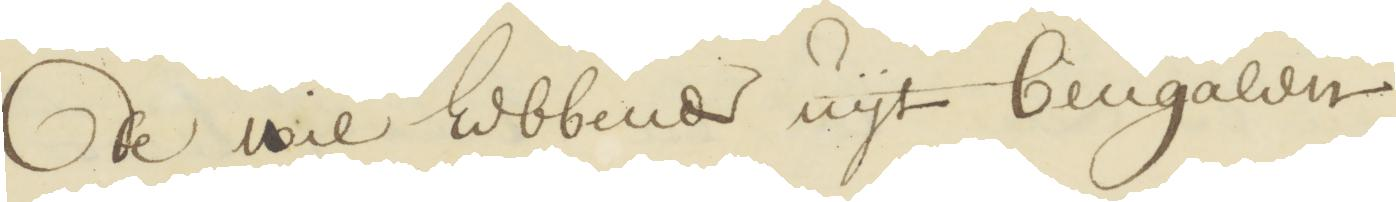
de wil hebbende uijt bengalen
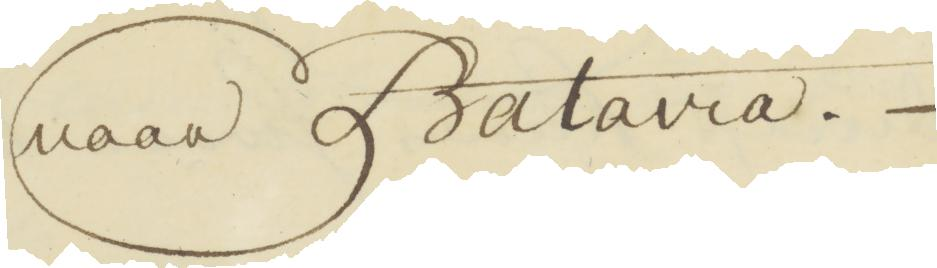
naar Batavia.-
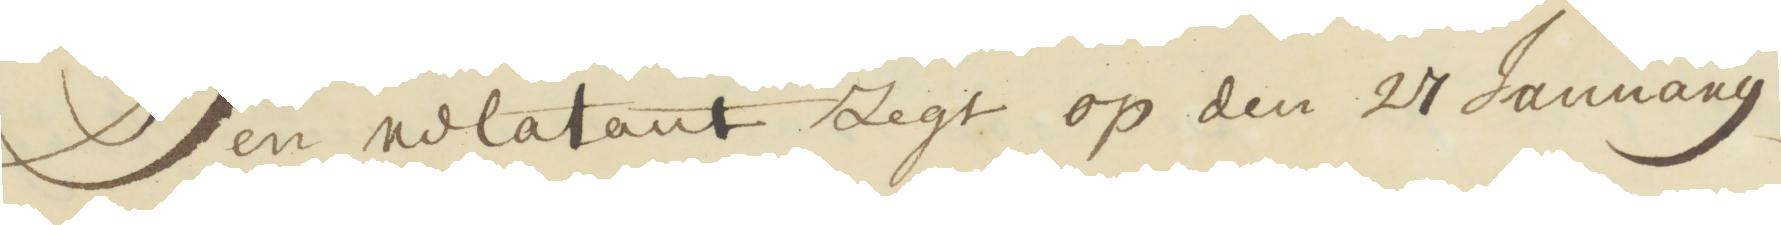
Den relatant zegt op den 27 Januarij
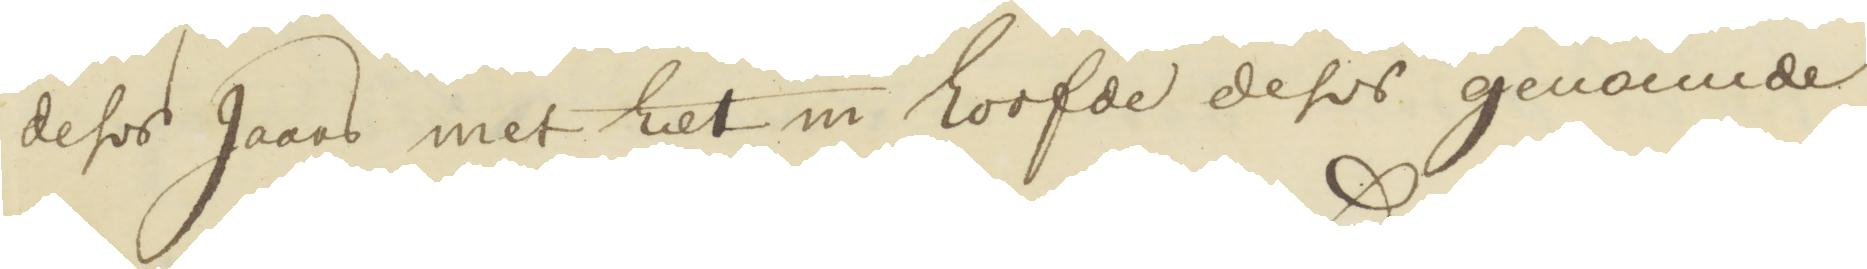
deses Jaars met het in hoofde deses genoemde
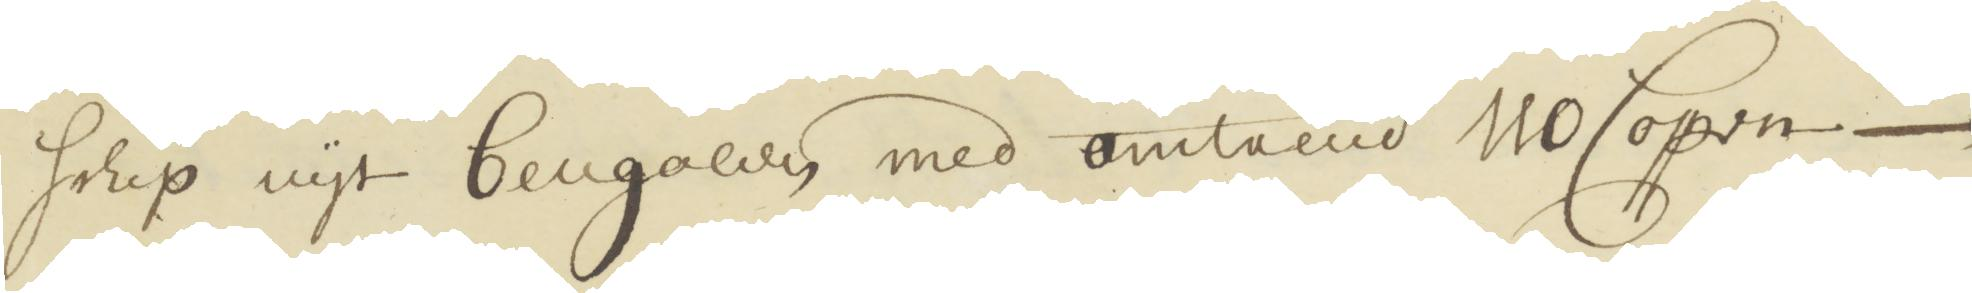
Schip uijt bengalen med omtrend 110 Coppen —
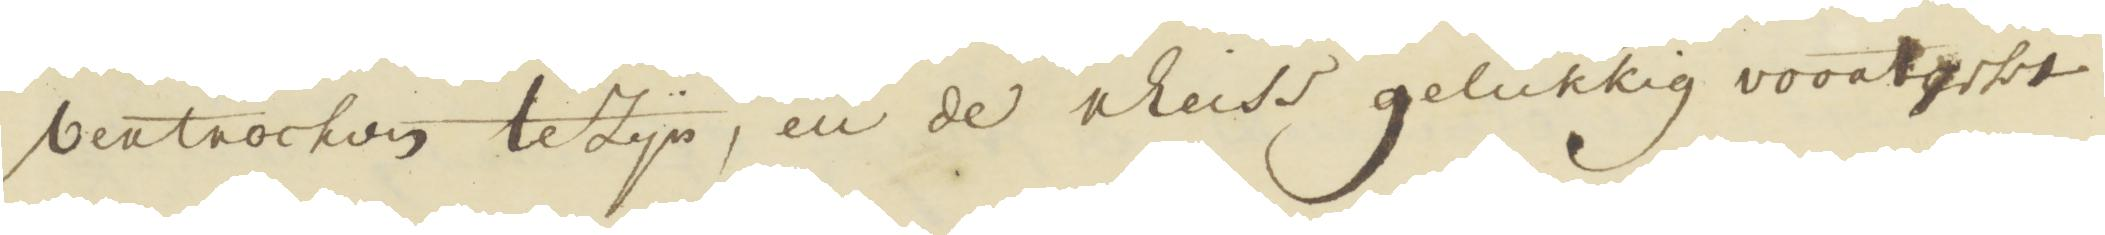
vertrocken te Zijn, en de rheise gelukkig voortgeset
